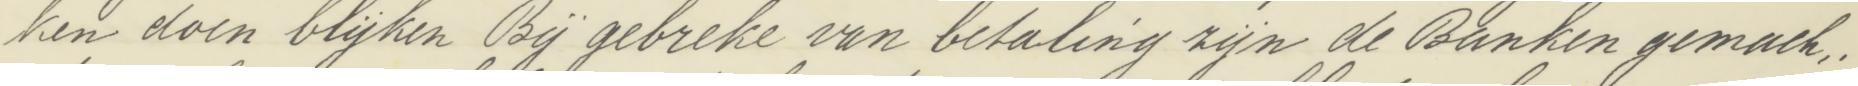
ken doen blijken Bij gebreke van betaling zijn de Banken gemach„
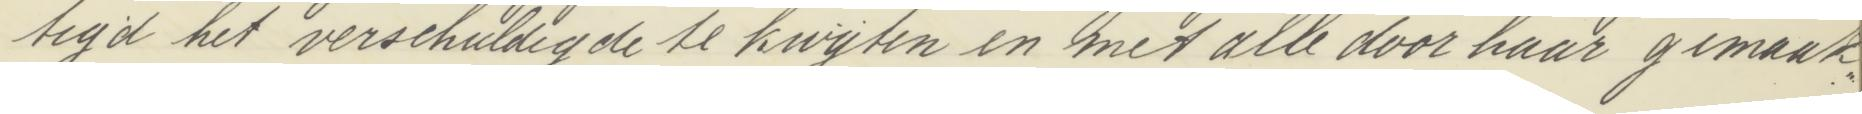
tigd het verschuldigde te kwijten en met alle door haar gemaak
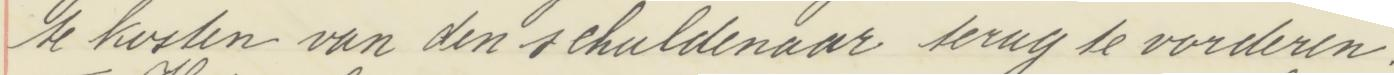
te kosten van den schuldenaar terug te vorderen
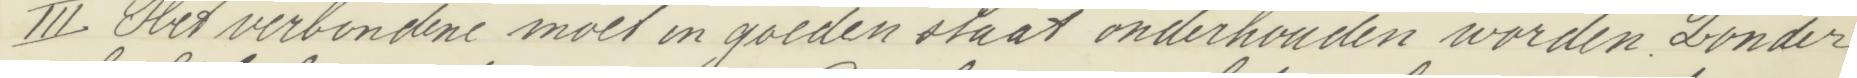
III Het verbondene moet in goeden staat onderhouden worden Zonder
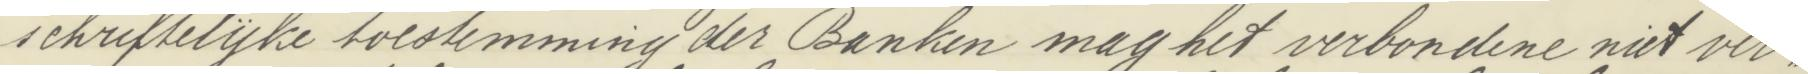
schriftelijke toestemming der Banken mag het verbondene niet ver„
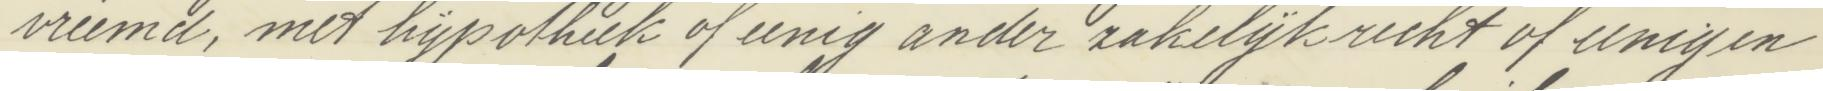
vreemd, met hijpotheek of eenig ander zakelijk recht of eenigen
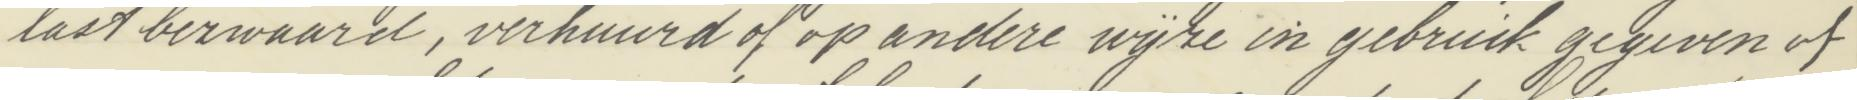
last bezwaard, verhuurd of op andere wijze in gebruik gegeven of
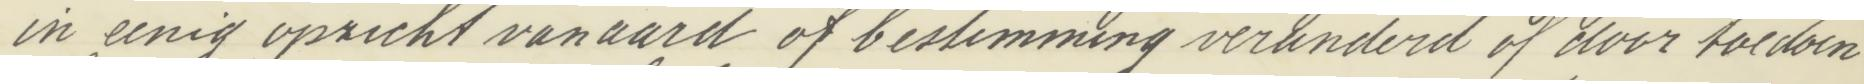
in eenig opzicht van aard of bestemming veranderd of door toedoen
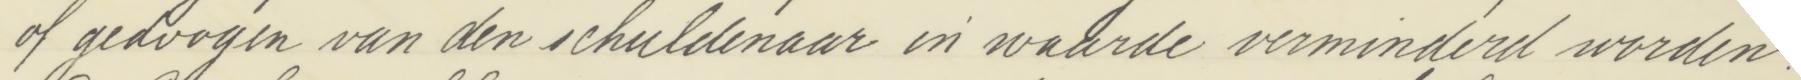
of gedoogen van den schuldenaar in waarde verminderd worden.
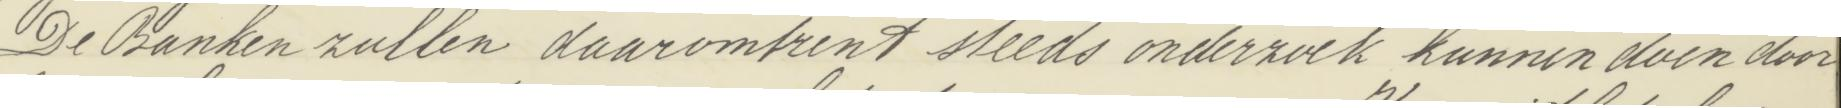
De Banken zullen daaromtrent steeds onderzoek kunnen doen door
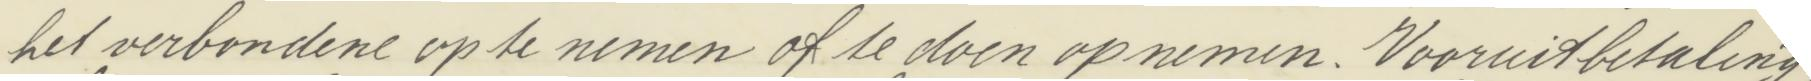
het verbondene op te nemen of te doen opnemen. Vooruitbetaling
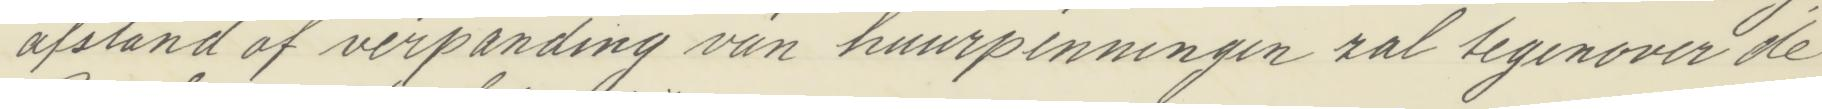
afstand of verpanding van huurpenningen zal tegen over de
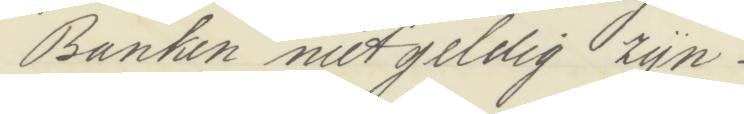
Banken niet geldig zijn.
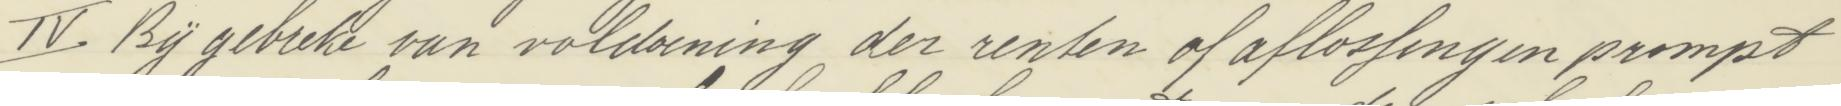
IV. Bij gebreke van voldoening der renten of aflossingen prompt
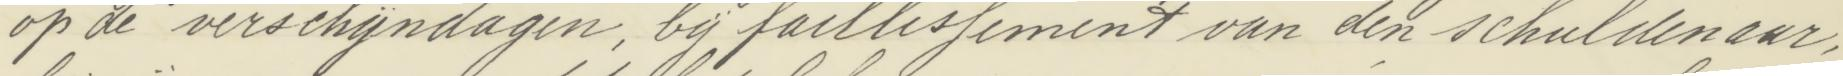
op de verschijndagen, bij faillissement van den schuldenaar,
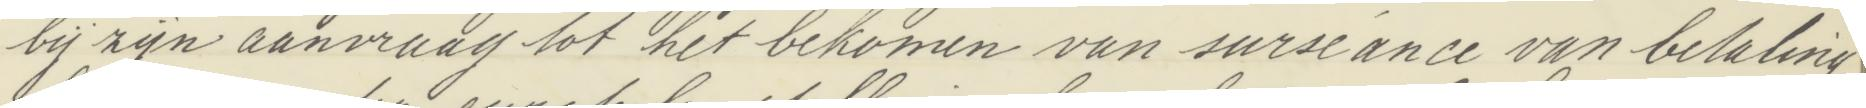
bij zijn aanvraag tot het bekomen van surseance van betaling
